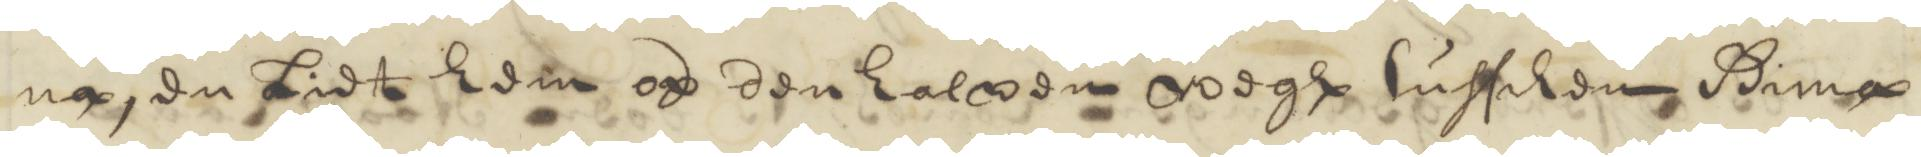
na, en Liet hem op den halven wegh tusschen Bima
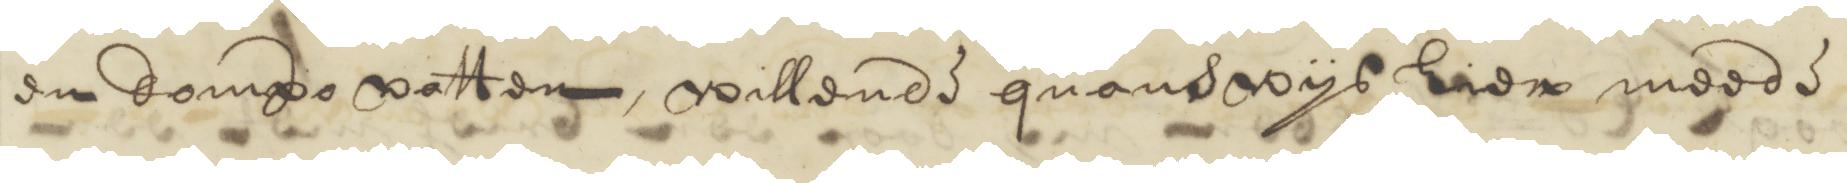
en dompo vatten, willende quanswijs hier meede
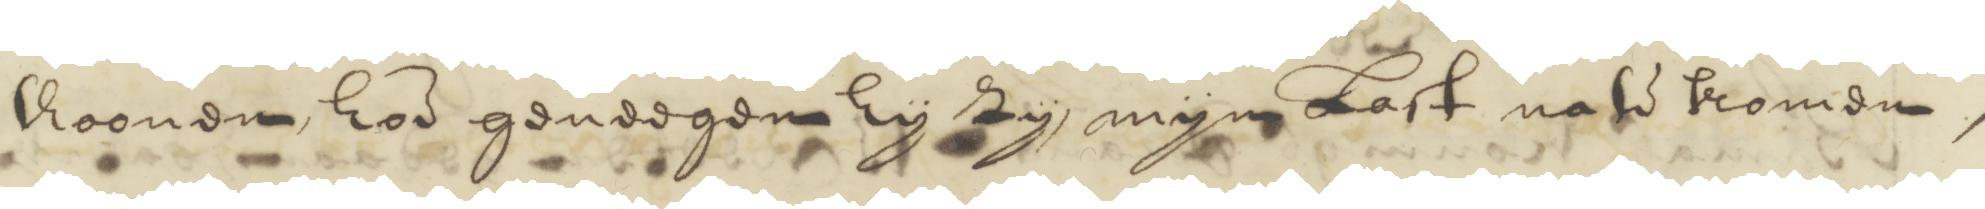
thoonen, hoe geneegen hij Zij, mijn Last na te komen,
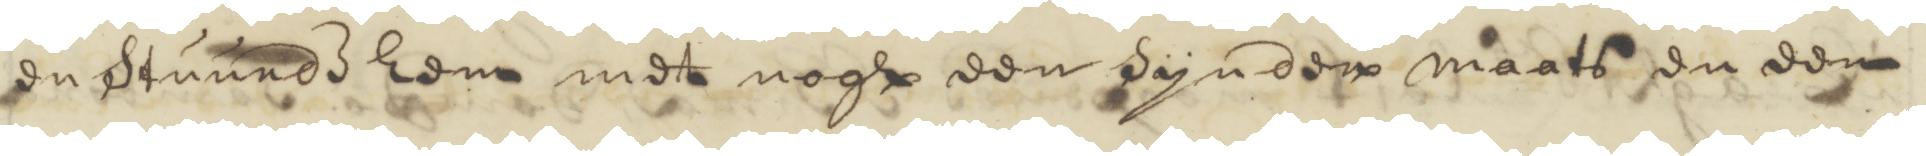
en stuurde hem met nogh een Sijn der maats en een
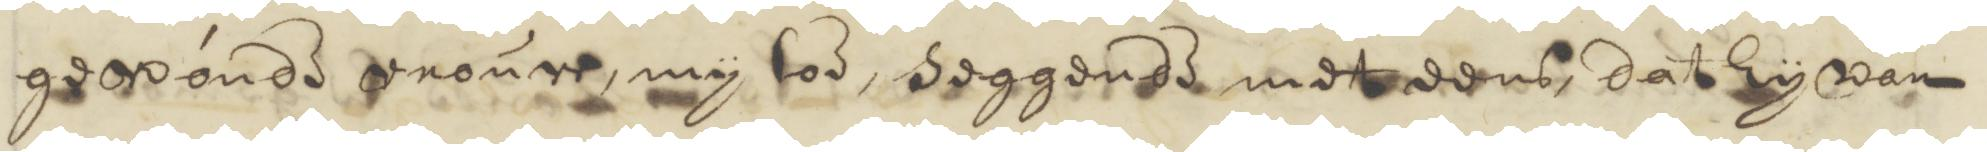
gewonde vrouw, mij toe, seggende met eens, dat hij van
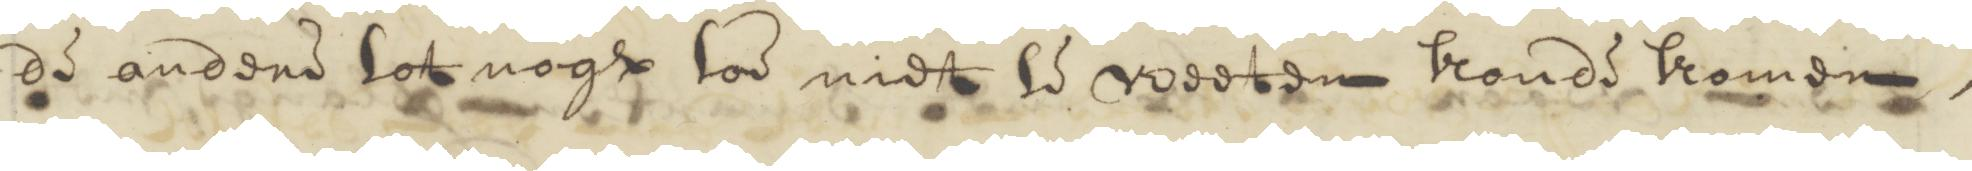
de andere tot nogh toe niet te weeten konde komen,
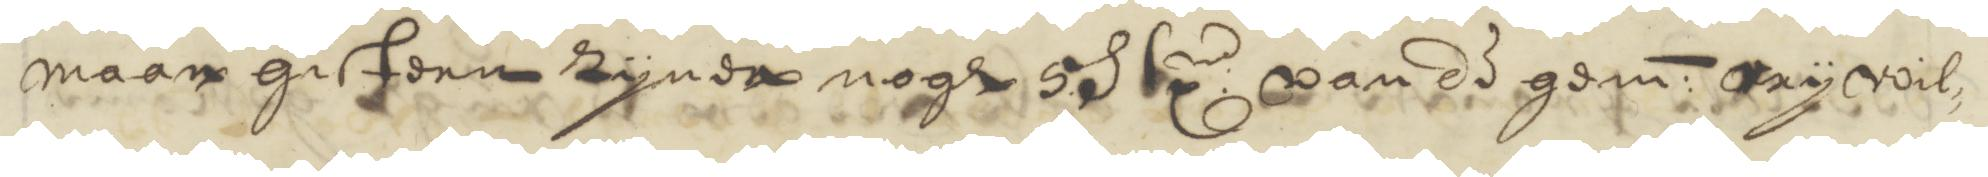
maar gistern Zijn er nogh 5 Stx: van de gem: vrij wil„
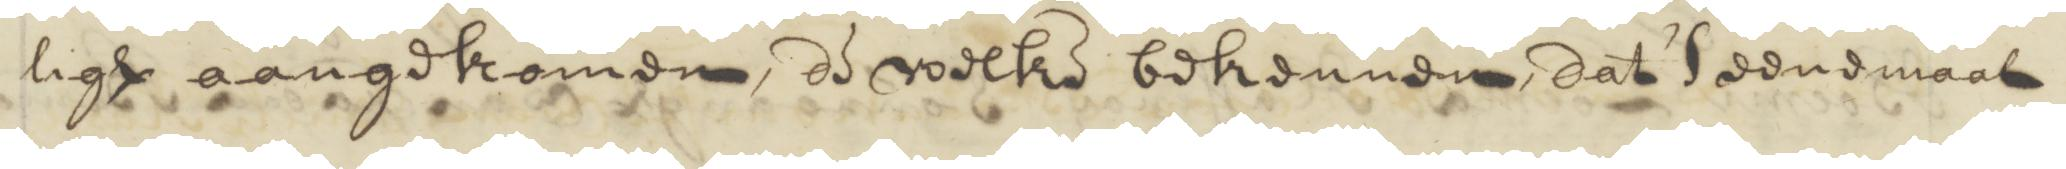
ligh aangekomen, de welke bekennen, dat ’t eenemaal
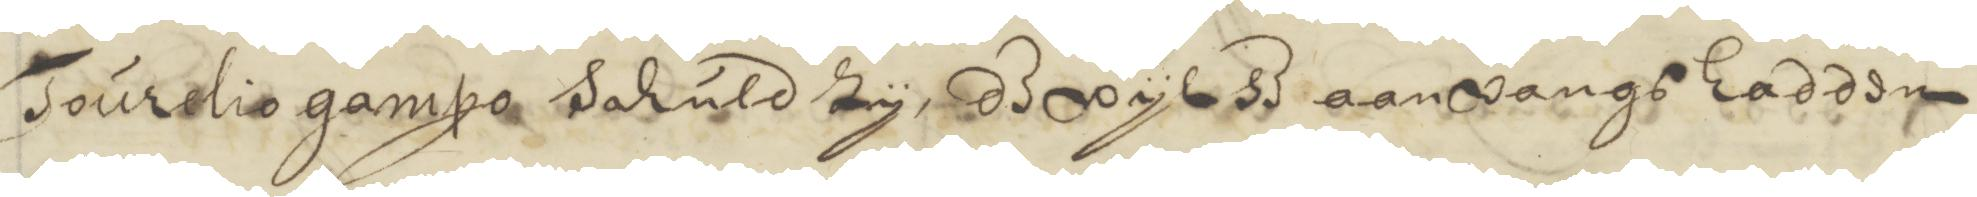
Tourolio gampa Schuld Zij, dewijlse aanvangs hadden
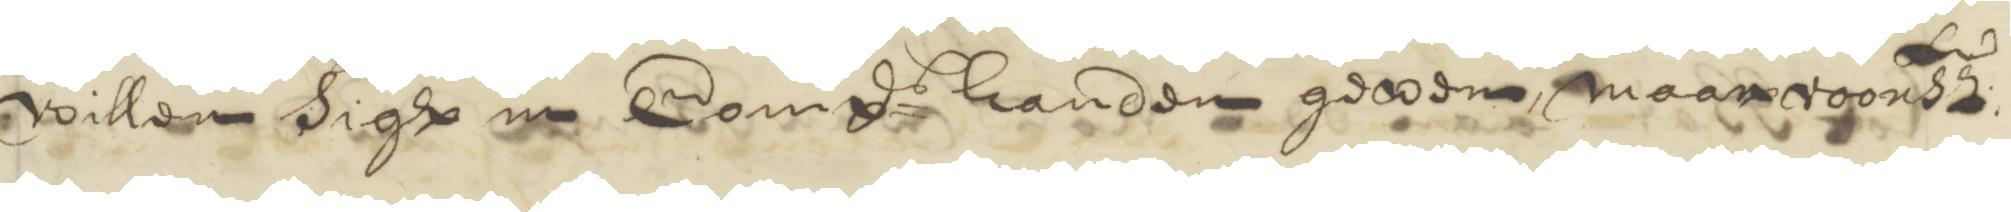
wille Sigh in Comp=s handen geven, maar voorsz:te
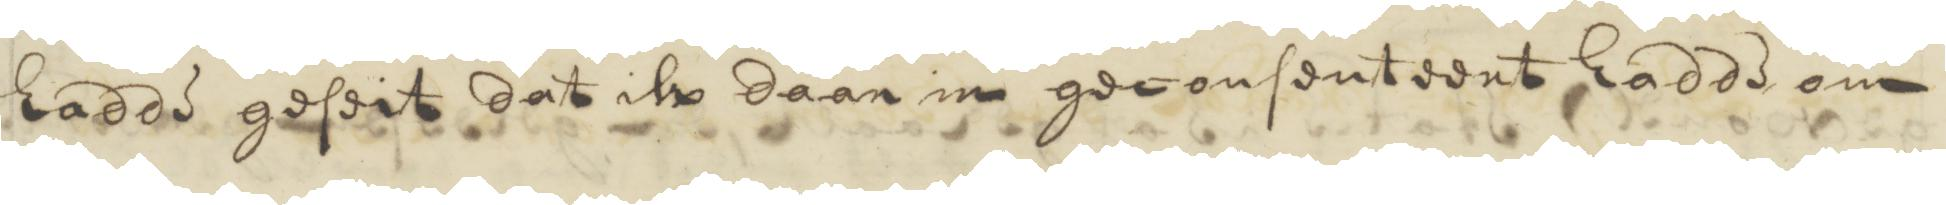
hadde geseit dat ik daar in geconsenteert hadde om
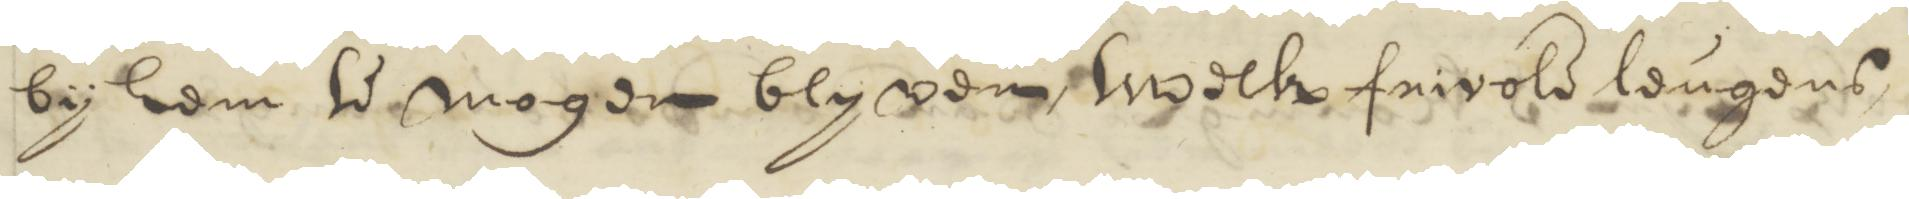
bij hem te mogen blijven, twelk frivole leugens,
